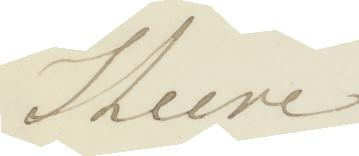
Heere
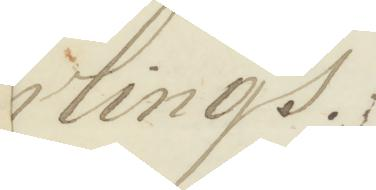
lings.
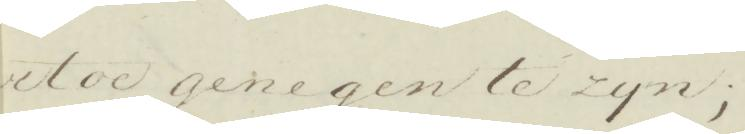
toe genegen te zyn;
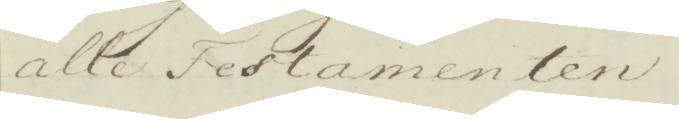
alle Testamenten
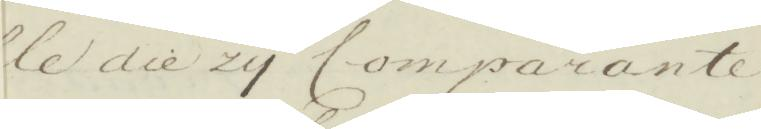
le die zy Comparante
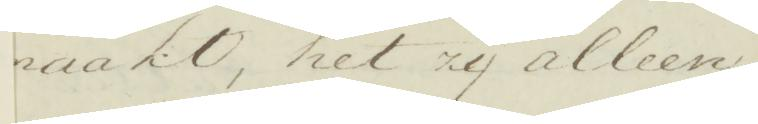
aakt, het zy alleen
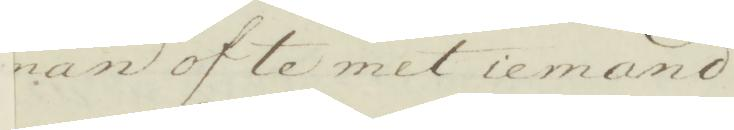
an of te met iemand
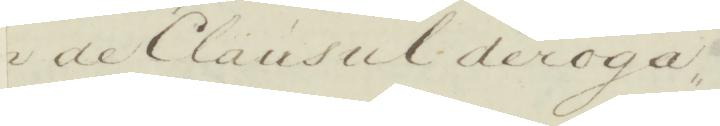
de Clausul deroga„
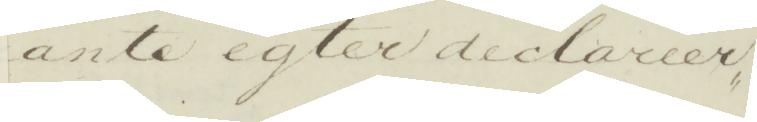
ante egter declareer„
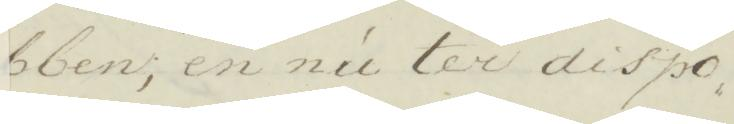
ben; en nu ter dispo„
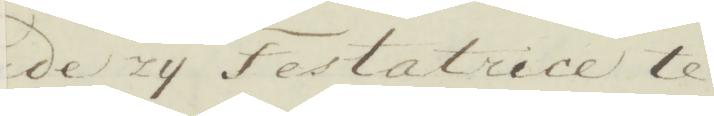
de zy Testatrice te
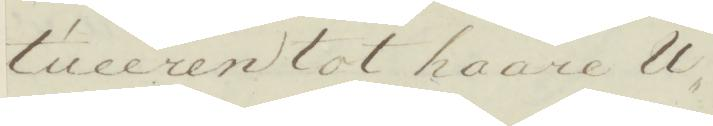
tueeren tot haare U„
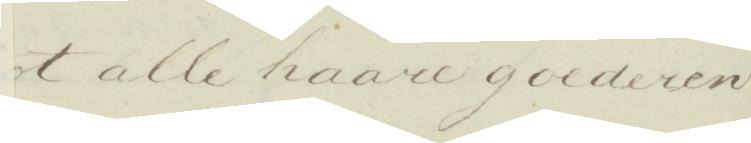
t alle haare goederen
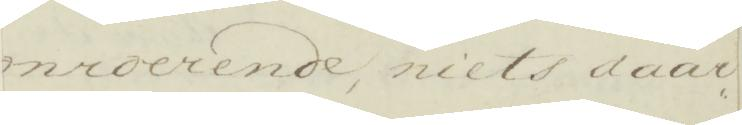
nroerende, niets daar„
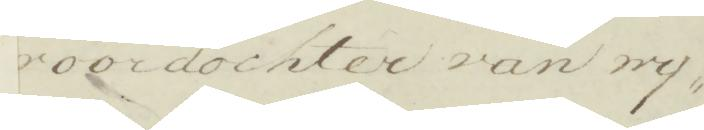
voordochter van wy„
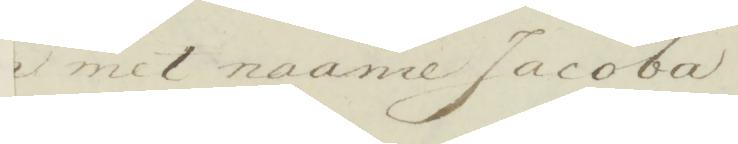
met naame Jacoba
